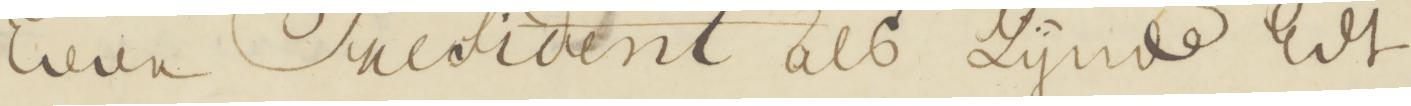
Heer President als zijnde het
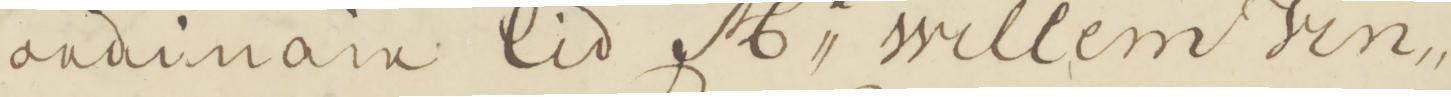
ordinair lid AC„n willem vin„
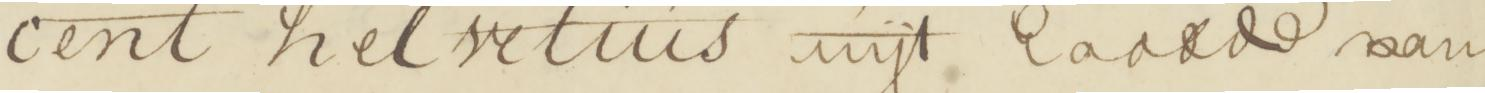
cent helvetius uijt hoofde van
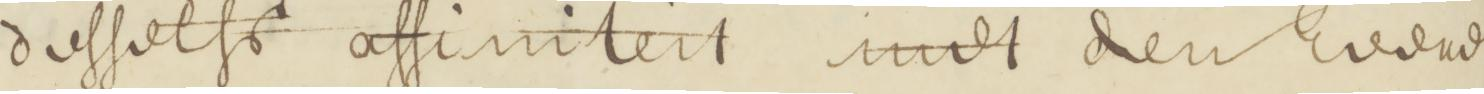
desselfs affiniteit met den heere
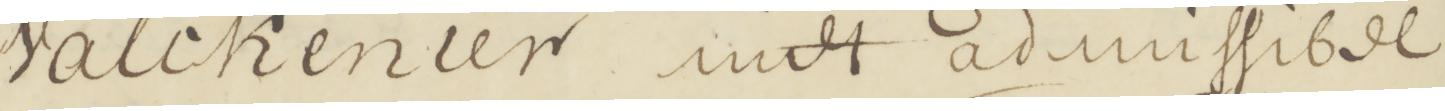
valckenier niet admissibel
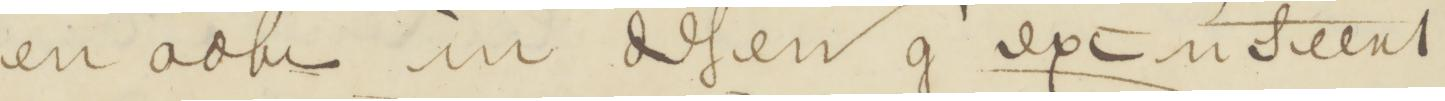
en ook in desen g'excuseert
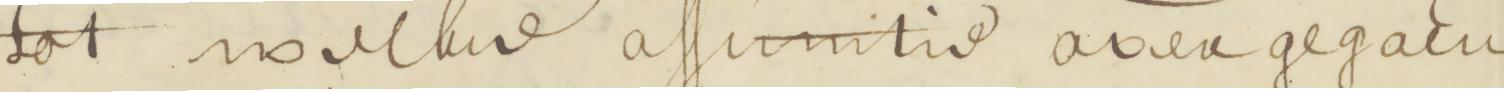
tot welke assistentie overgegaen
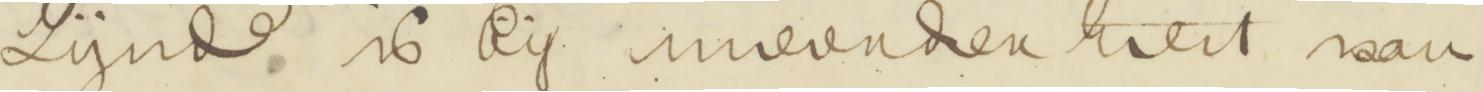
zijnde is bij meerderheit van
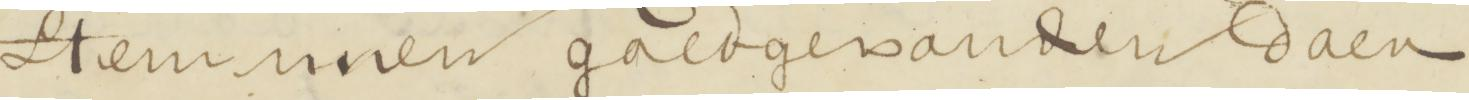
stemmen goedgevonden doen
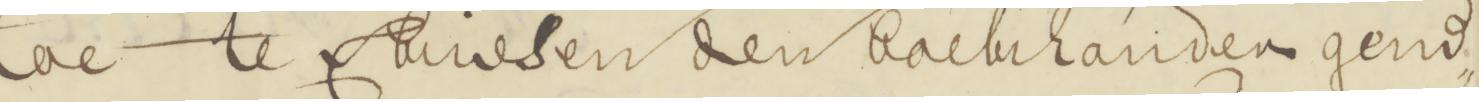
toe te verkiesen den boekhouder gene„
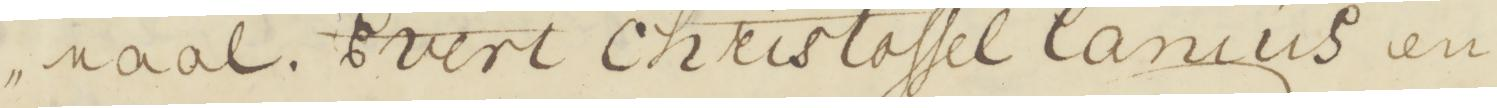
„raal. Evert christoffel canius en
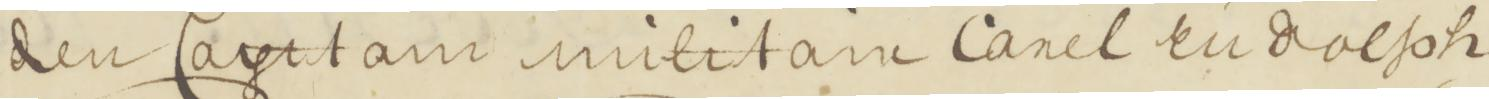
den Capitain militair carel rudolph
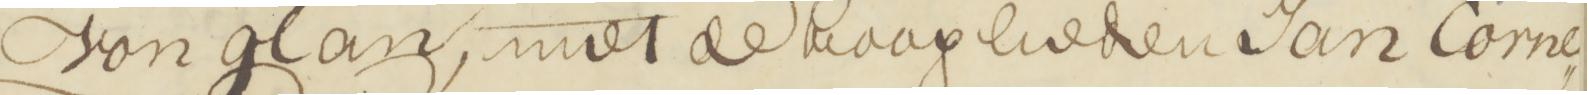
von Glan, met de kooplieden Jan Corne„
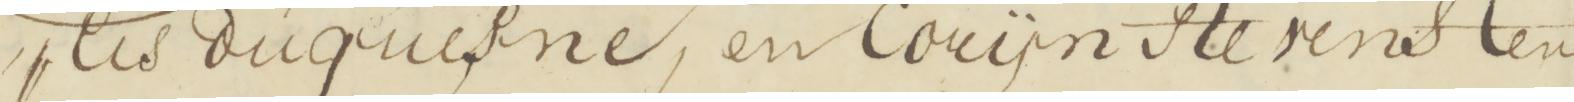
, „lis duquesne, en corijn stevens ten
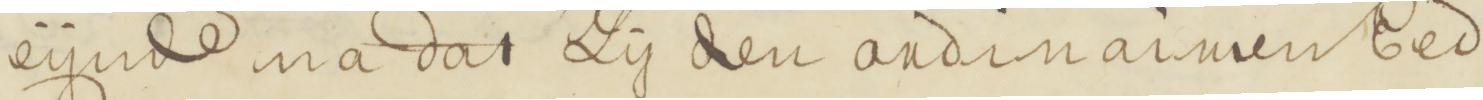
eijnde nadat zij den ordinairen Eed
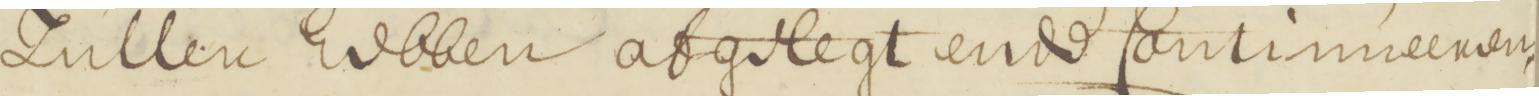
zullen hebben afgelegt ende Continueeren„
